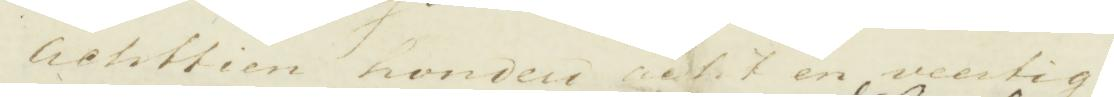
achttien honderd acht en veertig
